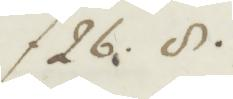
ƒ26: 8.
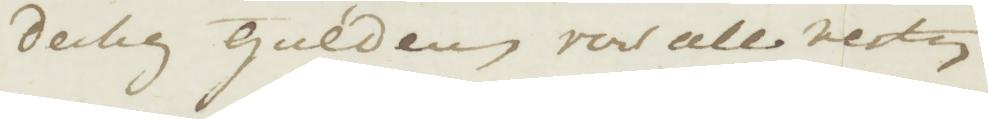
dertig guldens voor alle renten
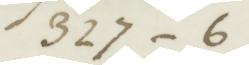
327 - 6
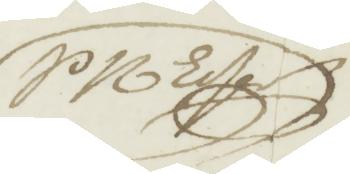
V N Eeser
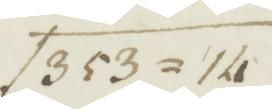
ƒ353 = 14
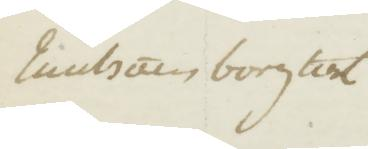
Rantsoen borgtogt
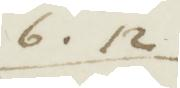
6. 12
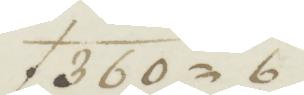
ƒ 360 = 6
